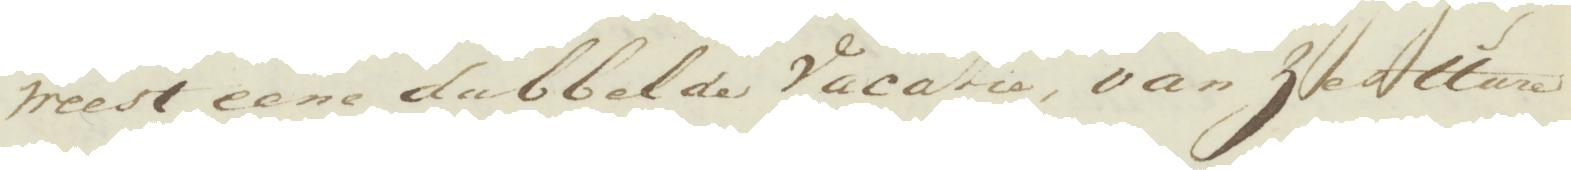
weest eene dubbelde Vacatie, van Zes Uure
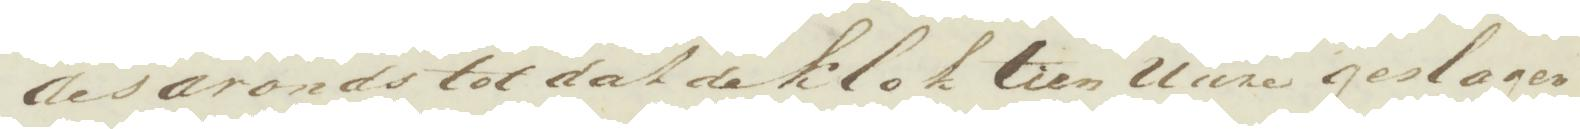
des avonds tot dat de klok tien Uure geslagen
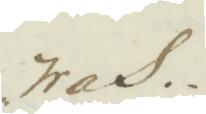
was.
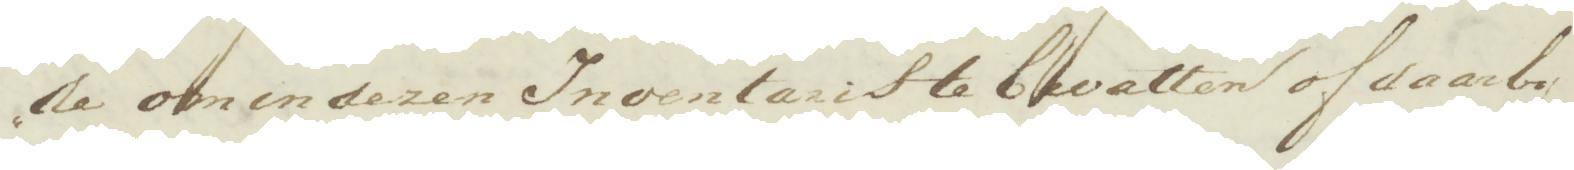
„de om in dezen Inventaris te bevatten of daarby
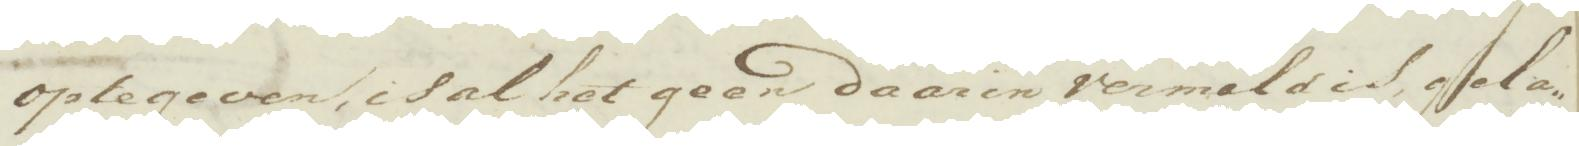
op te geven, is al het geen daarin vermeld is, gela„
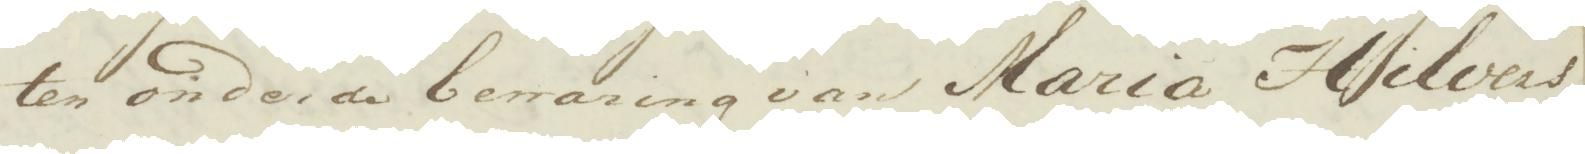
ten onder de bewaring van Maria Hilvers,
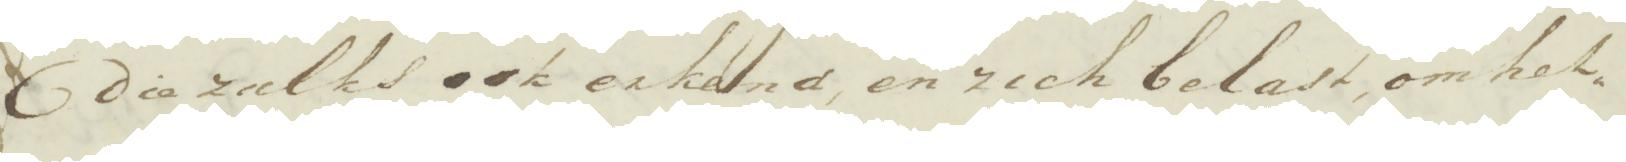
die zulks ook erkend, en zich belast, om het„
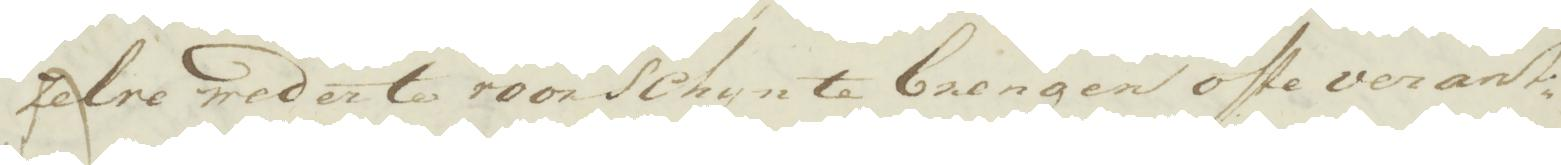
zelve weder te voorschyn te brengen ofte verant„
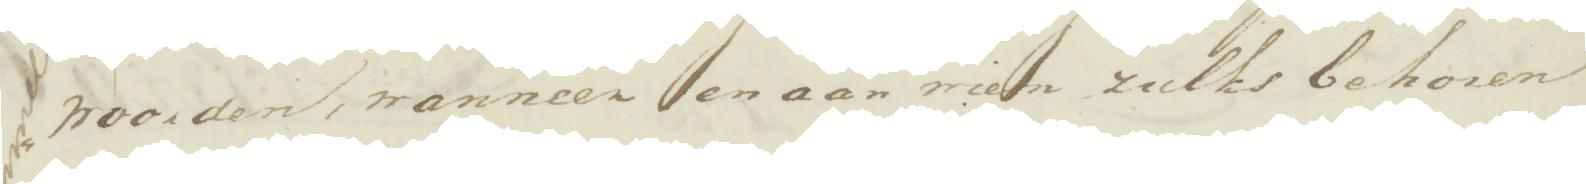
woorden, wanneer en aan wien zulks behoren
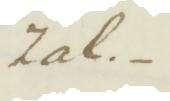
zal. -
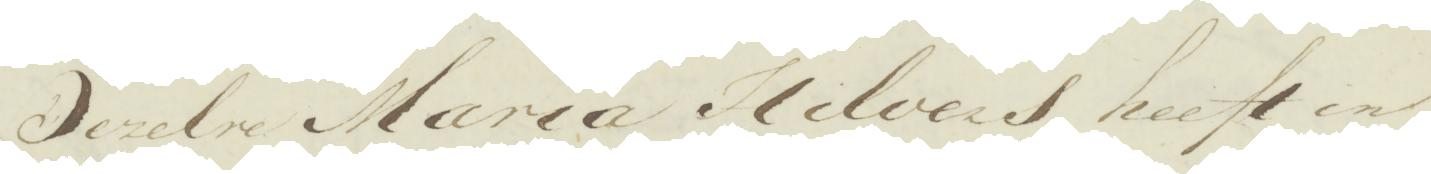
Dezelve Maria Hilvers heeft in
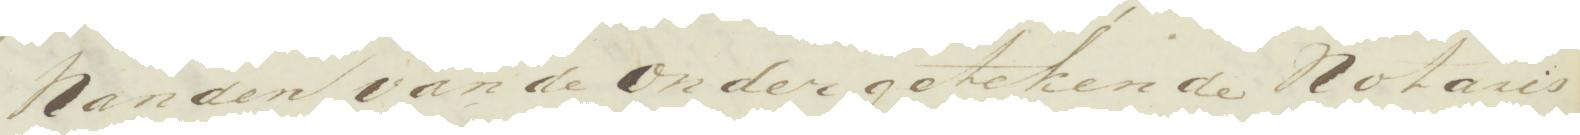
handen van de ondergetekende Notaris
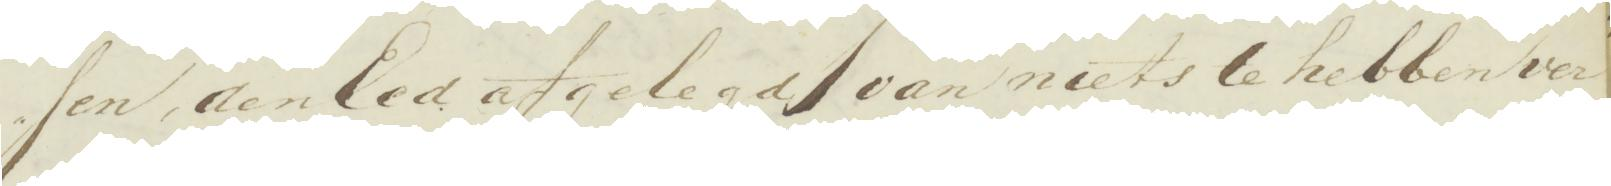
„sen, den Eed afgelegd van niets te hebben ver
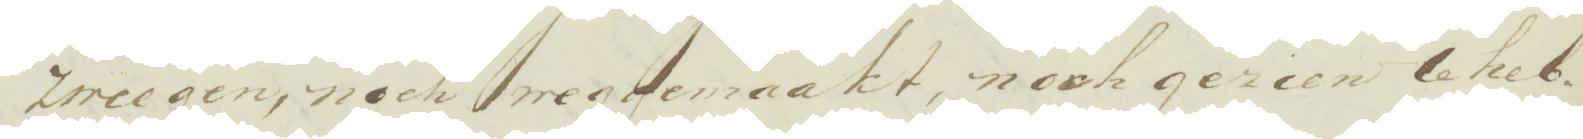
zweegen, noch weggemaakt, noch gezien te heb„
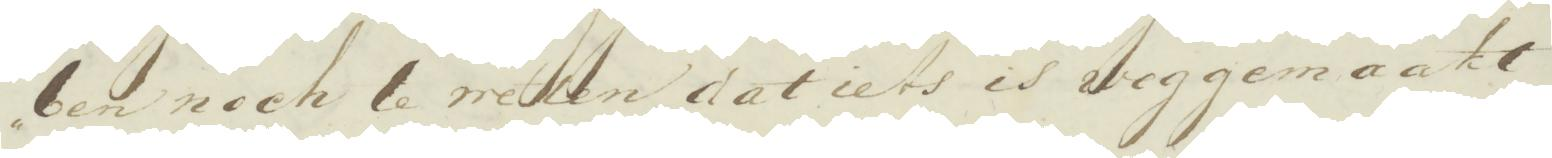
„ben noch te weten dat iets is weggemaakt
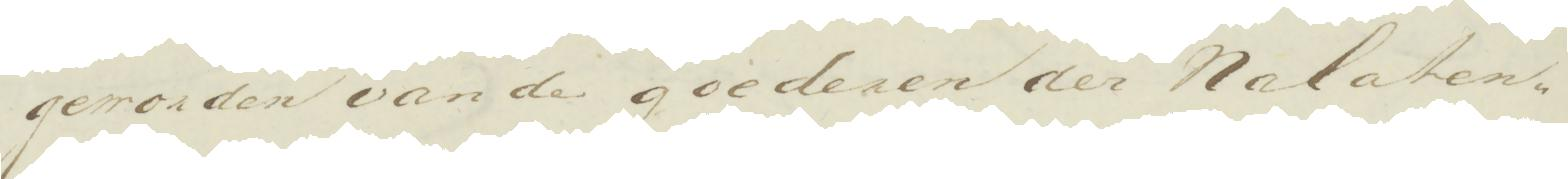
geworden van de goederen der Nalaten„
